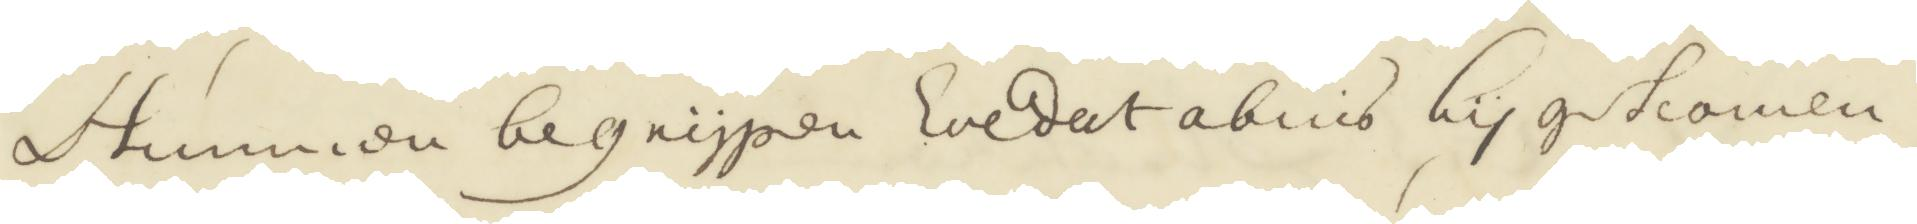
te kunnen begrijpen hoedat abuis bij gekomen
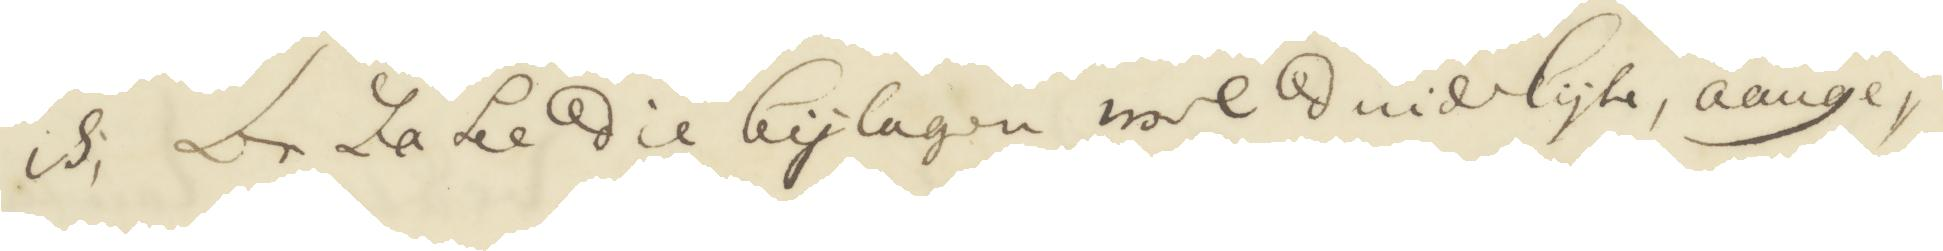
is, ter zake die bijlagen wel duidelijk, aange„
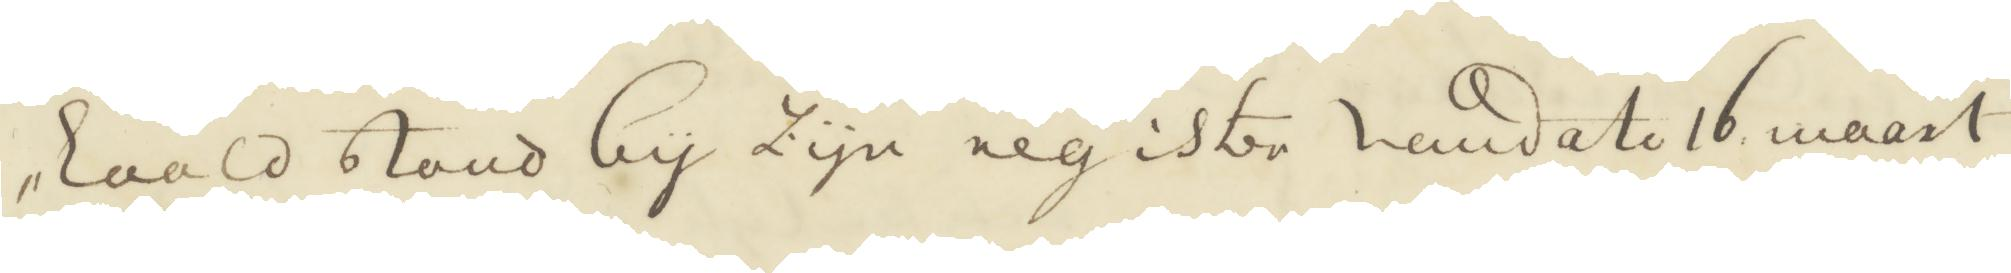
„haald stond bij zijn register van dato 16: maart
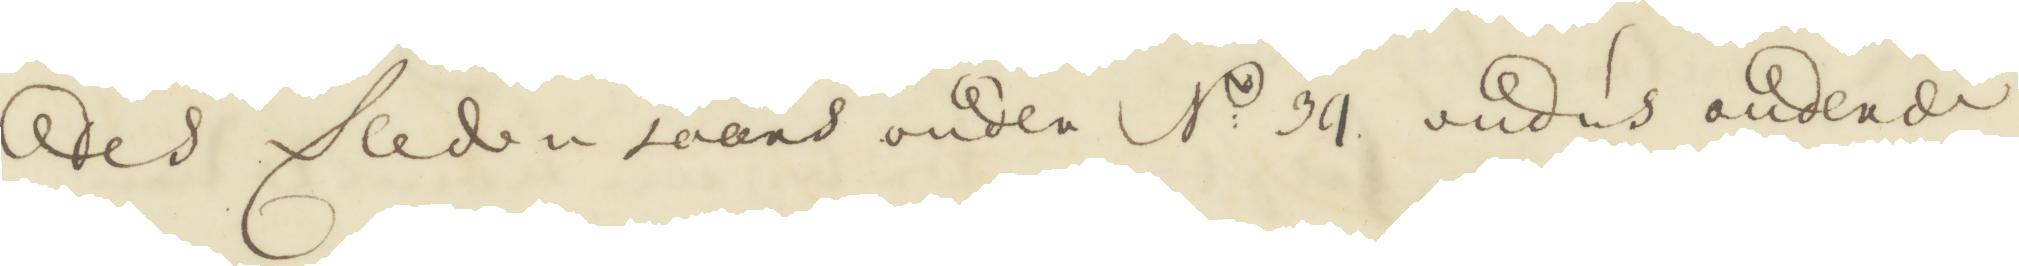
des verleden jaars onder N:o 34. en dus onder de
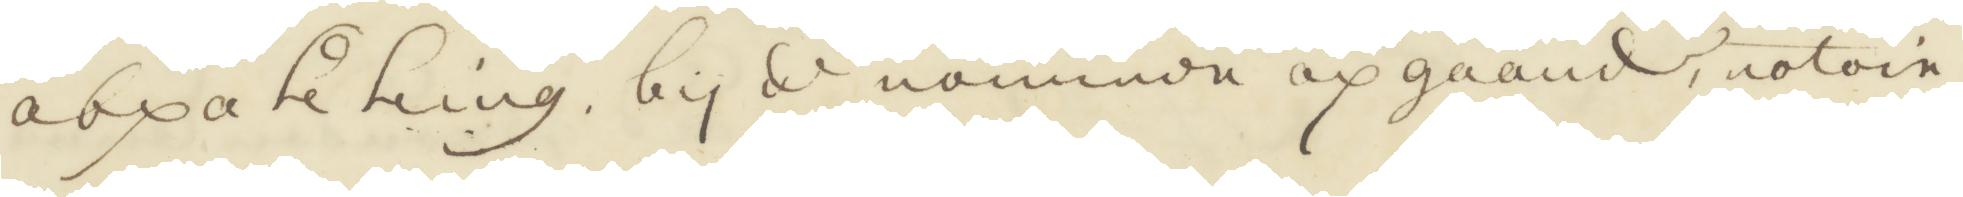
afpakking, bij de nommer opgaande, notoir
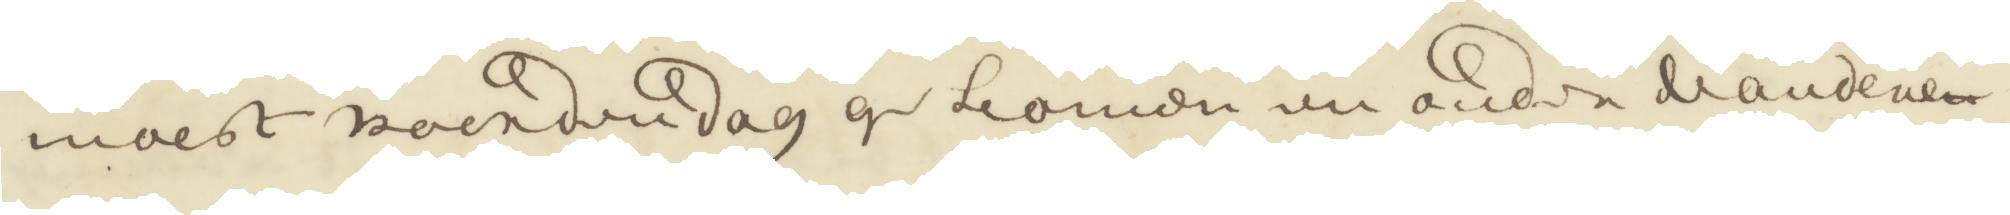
moest voerdendag gekomen en onder de anderen
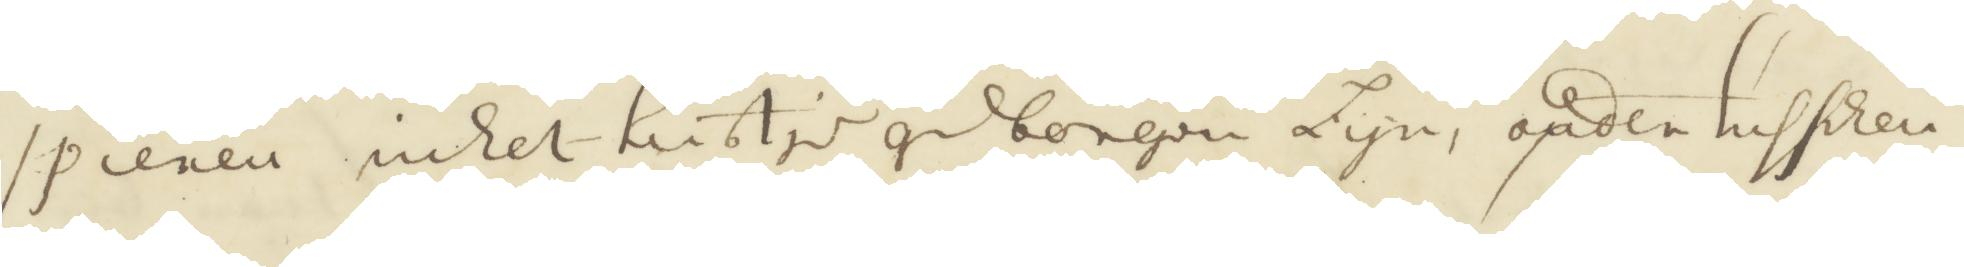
ppieren in het kistje geborgen zijn, onder tusschen
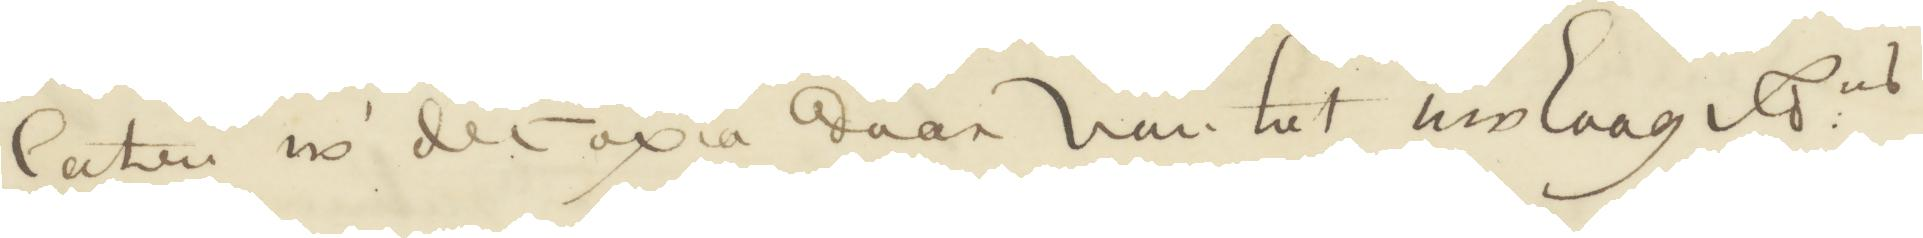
laten w' de copia daar van het uw hoog Ed:ns
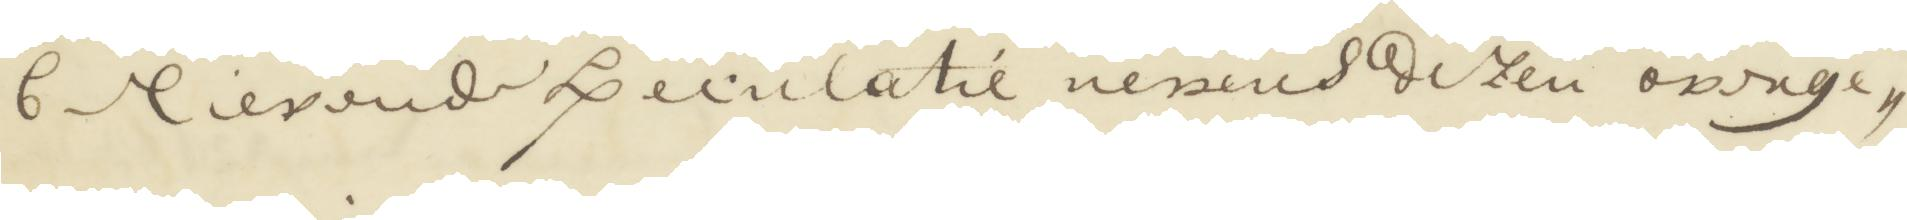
believende speculatie nevens dezen overge„
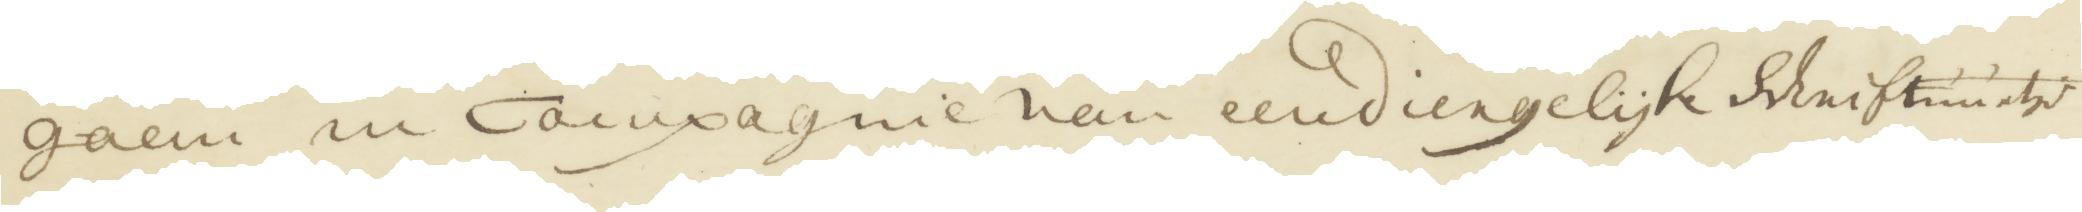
gaene in compagnie van een diergelijk schriftuurtje
